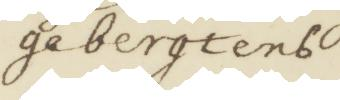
gebergtens :
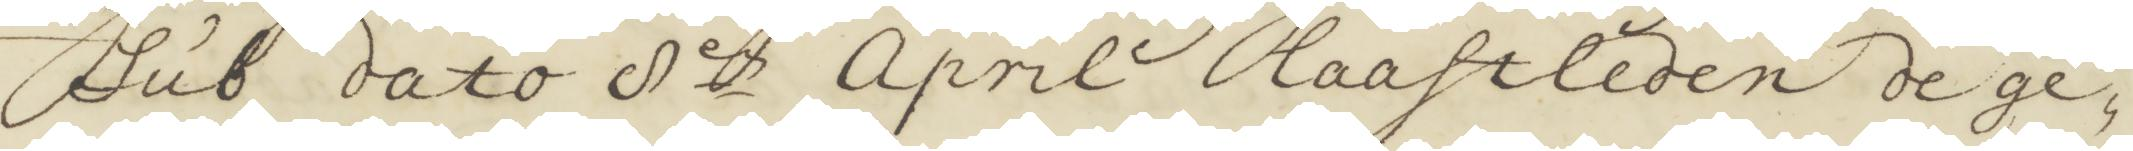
sub dato 8=en April laastleden de ge„
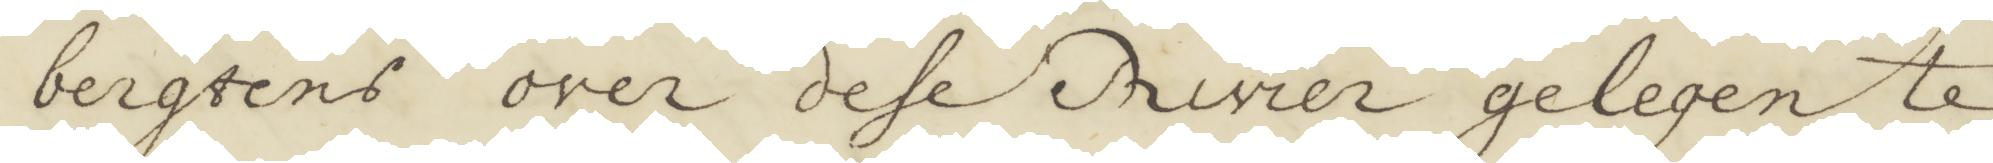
bergtens over dese Rivier gelegen te
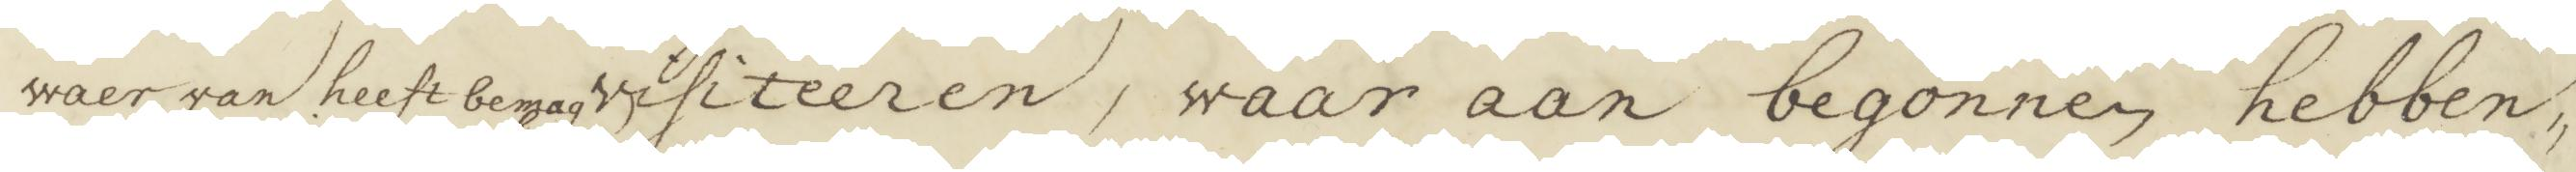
waer van heeft bemag visiteeren, waar aan begonnen hebben„
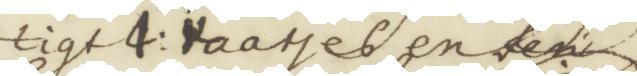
tigt 4: vaatjes en een
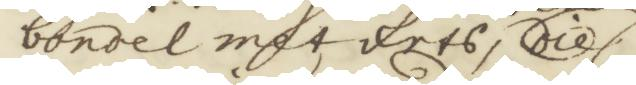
bondel met erts, die
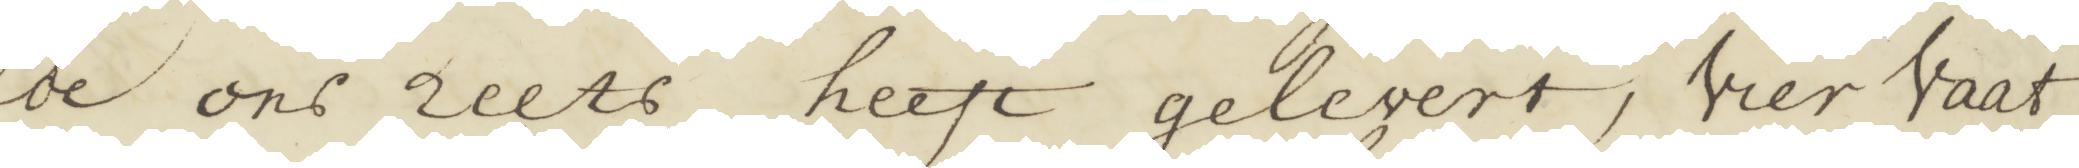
de ons reets heeft gelevert, vier vaat
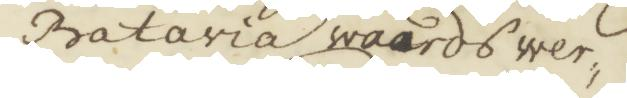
Batavia waards wer„
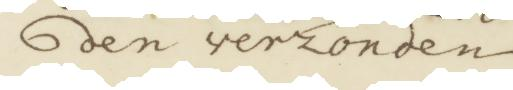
den verzonden.
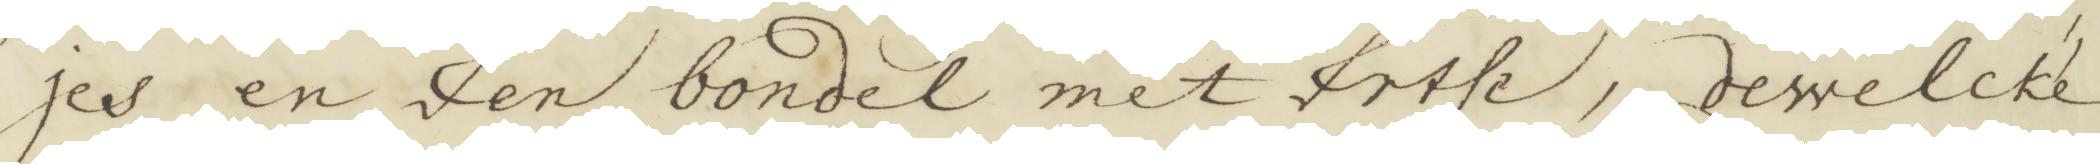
ses en een bondel met ertse, dewelcke
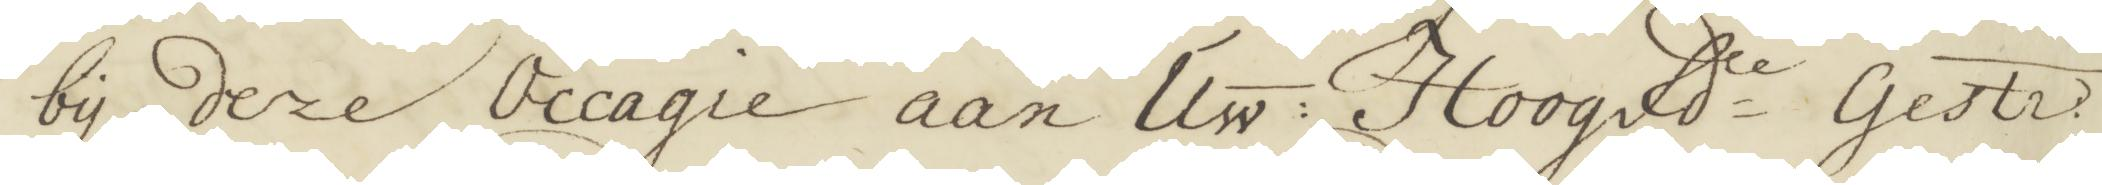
bij deze Occagie aan Uw: HoogEd=e gestr:
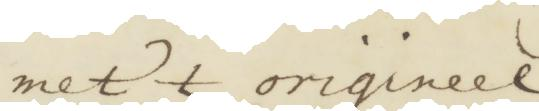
met ’t origineel
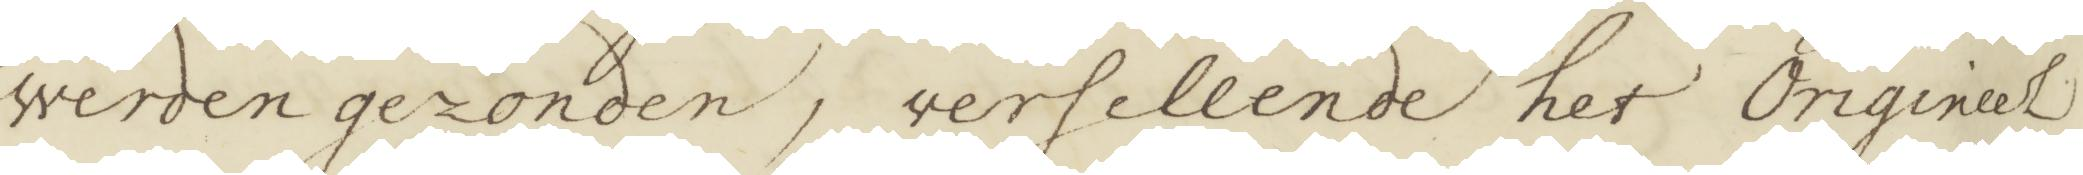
werden gezonden, versellende het Origineel
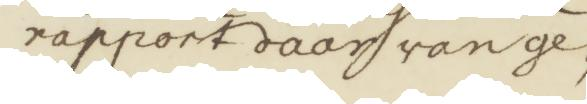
rapport daar van ge„
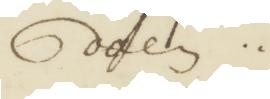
daen .. —
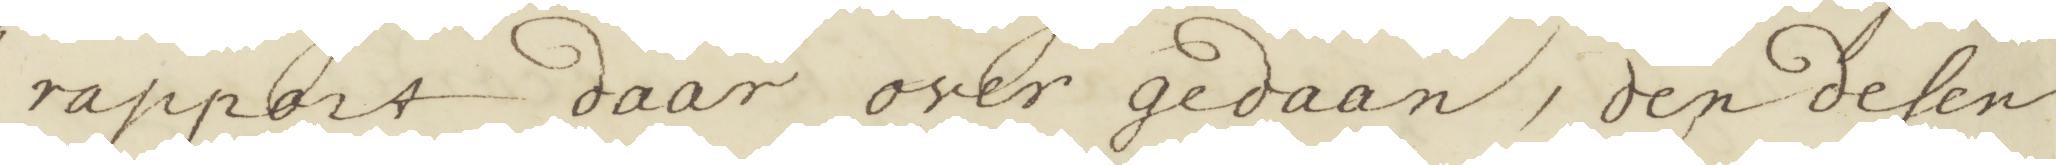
rapport daar over gedaan, den desen
